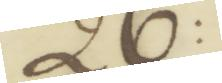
26:
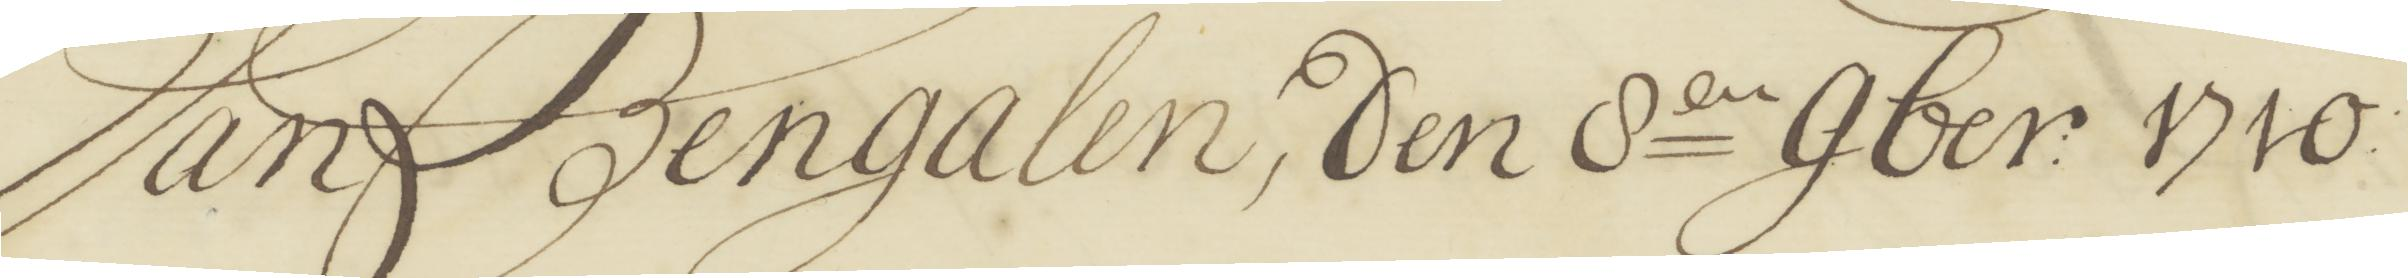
Van Bengalen, den 8=en 9ber: 1710:
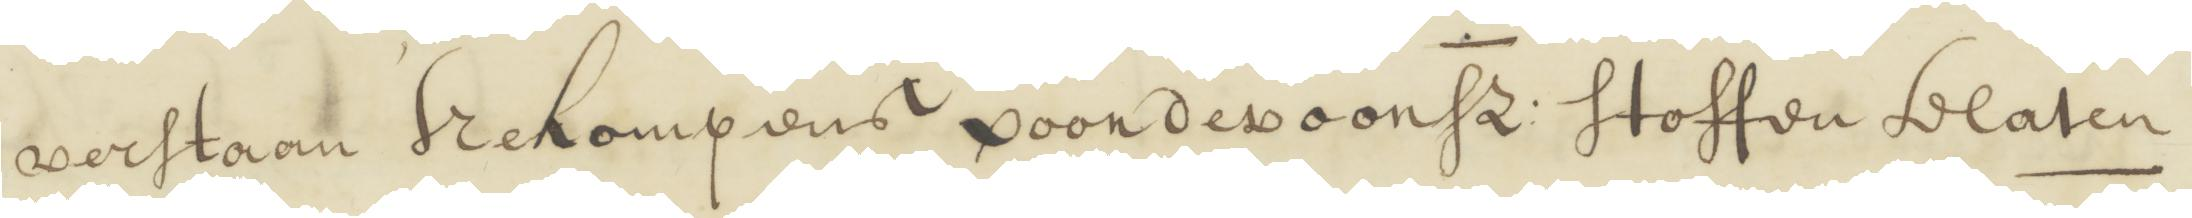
verstaan 't rekompens voor de voorsz: stoffen te laten
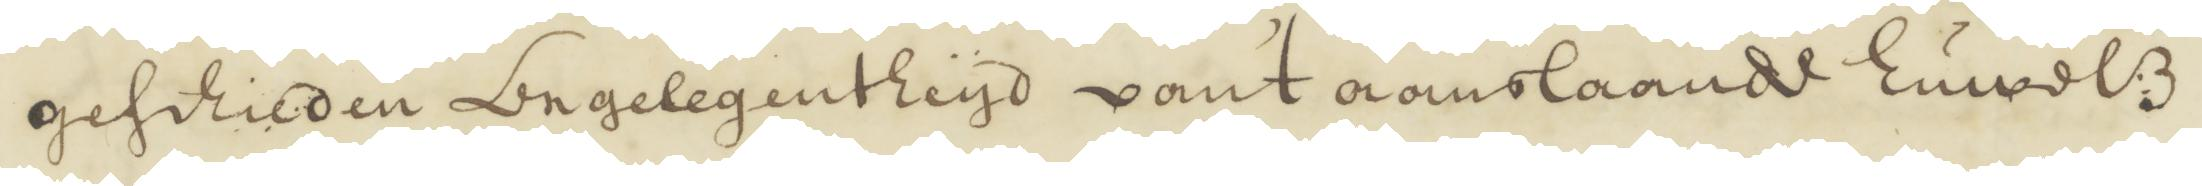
geschieden ter gelegentheijd van 't aanstaande huwelijk
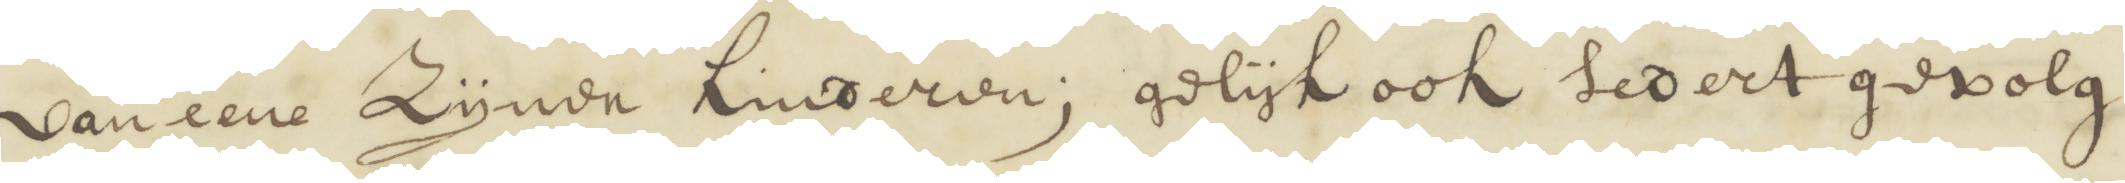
van eene Zijner kinderen; gelijk ook sedert gevolg
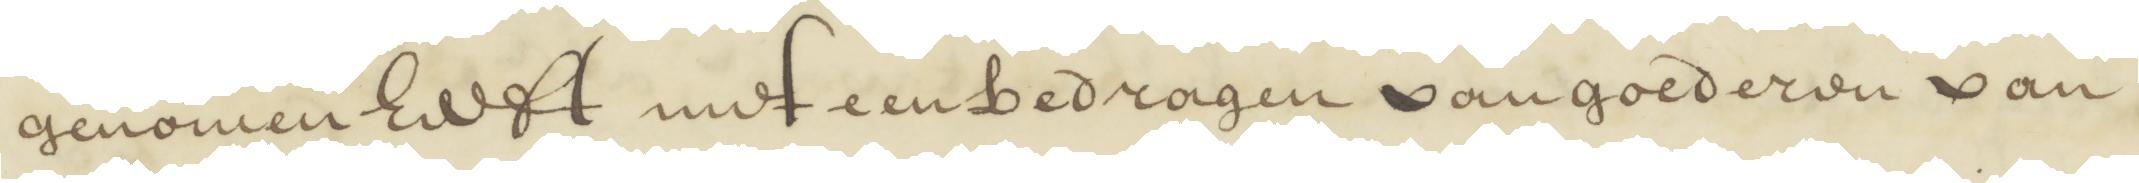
genomen heeft met een bedragen van goederen van
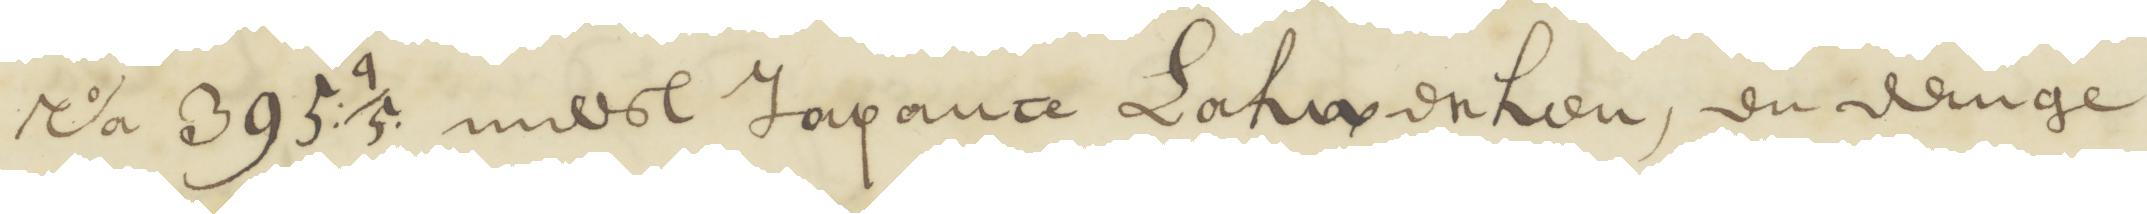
r:o/a 395:4/5. meest Japance Lakwerken, en eenige
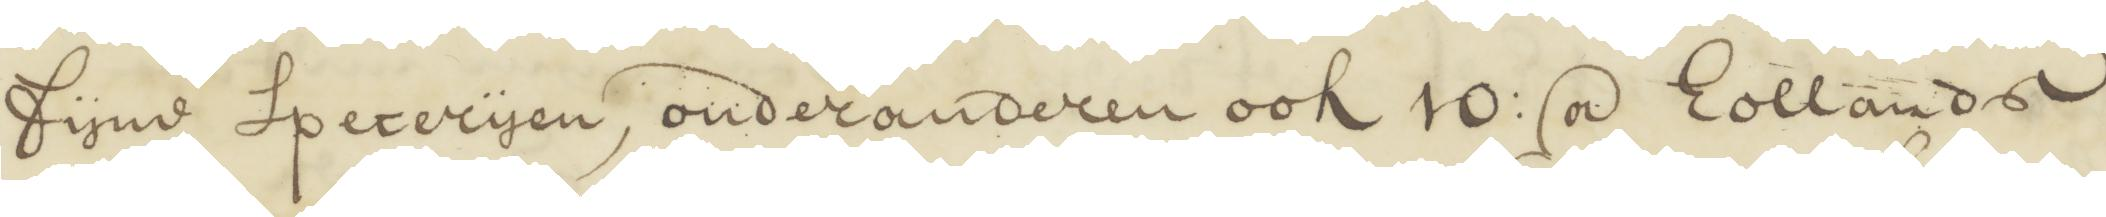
fijne specerijen, onder anderen ook 10: @ hollands
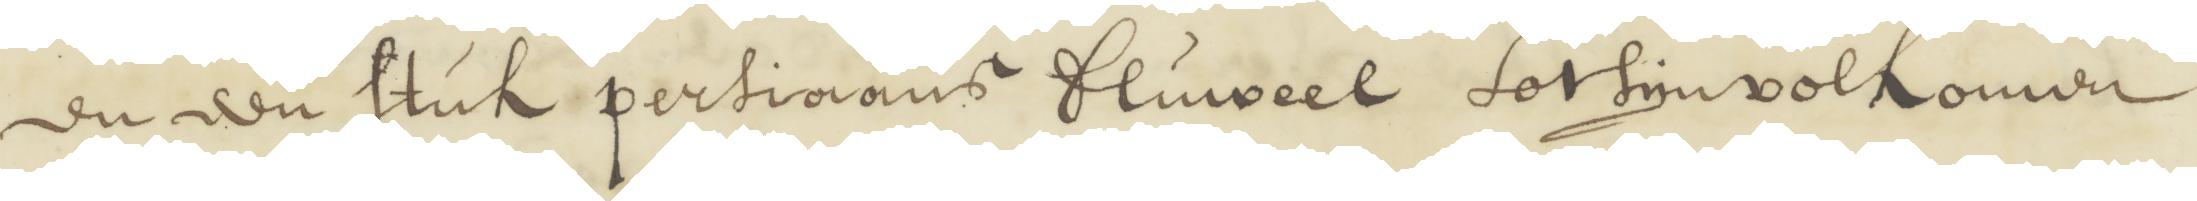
en een stuk persiaans fluweel tot sijn volkomen
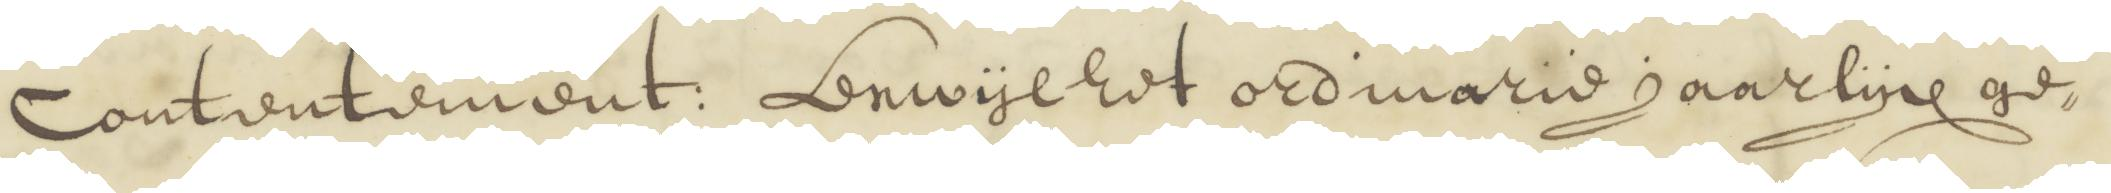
Contentement: terwijl het ordinarie jaarlijx ge„
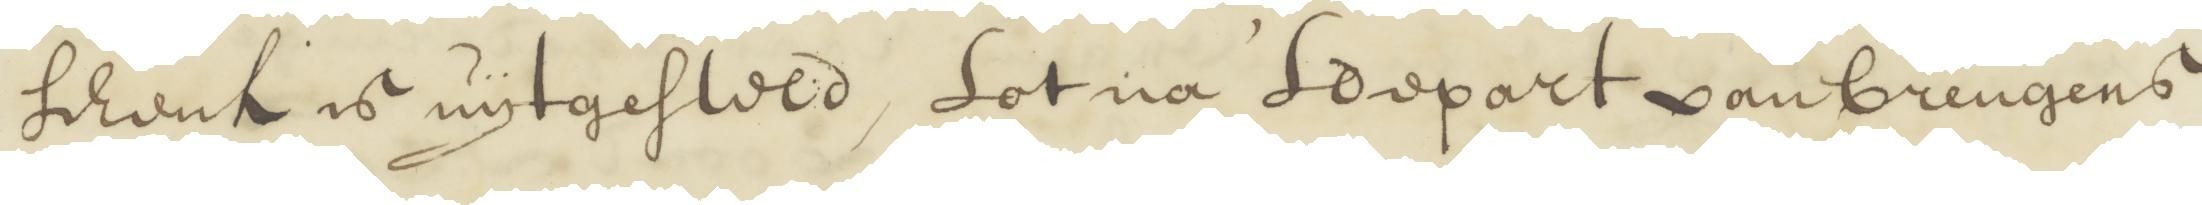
schenk is uijtgesteld, tot na 't depart van brengens
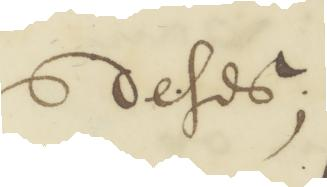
deses;
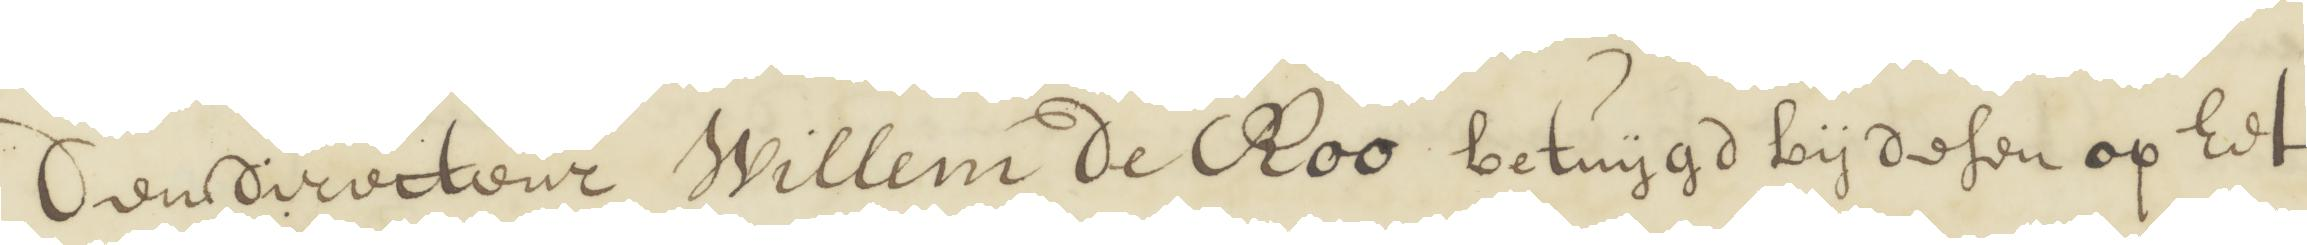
den directeur Willem de Roo betuijgd bij desen op het
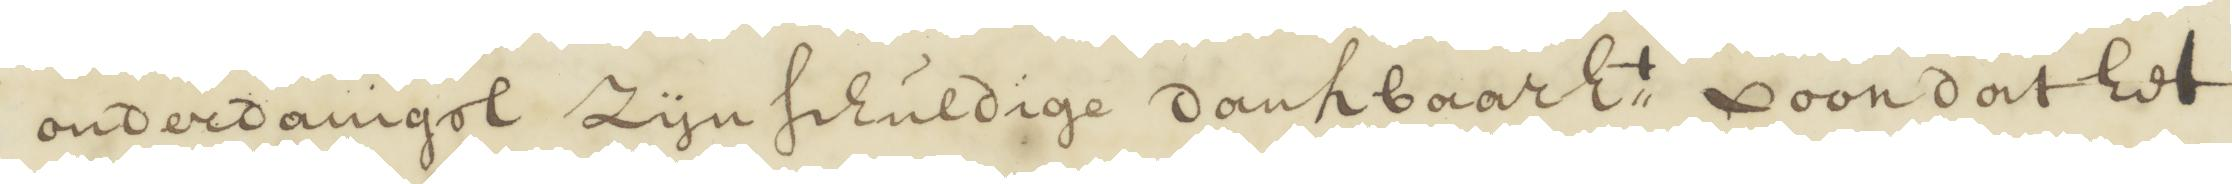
onderdanigst Zijn schuldige dankbaarh„t voor dat het
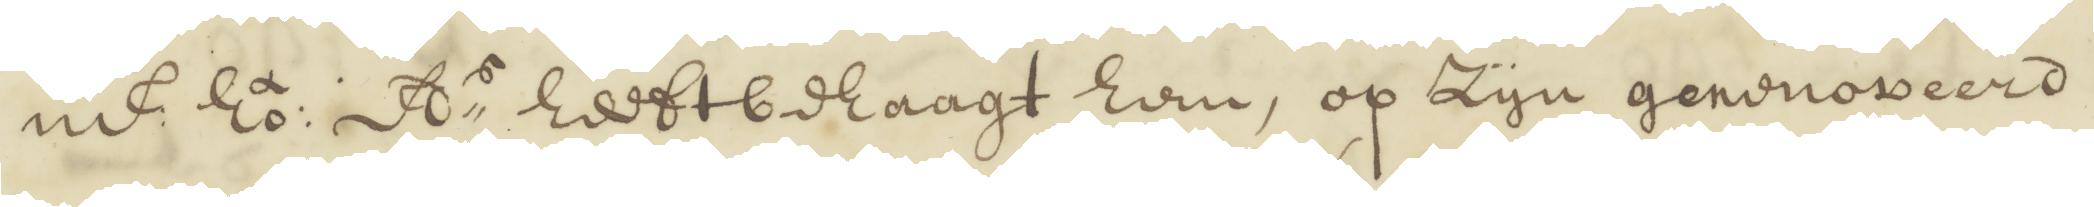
uE: ho: Ed„s heeft behaagt hem, op Zijn gerenoveerd
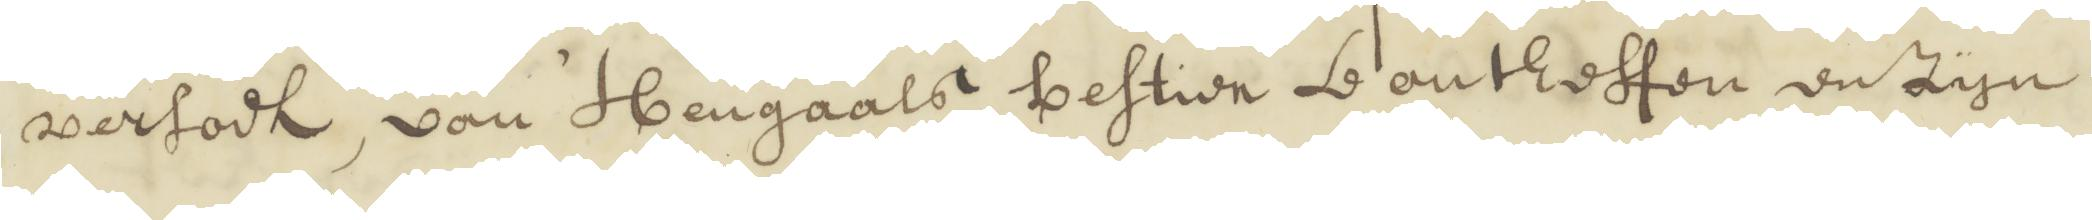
versoek, van 'tbengaals bestier te ontheffen en Zijn
